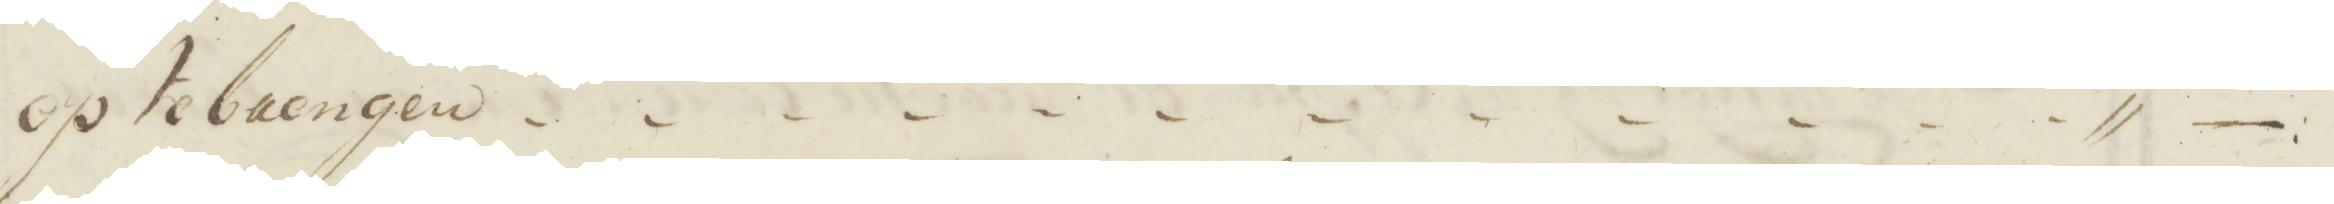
op te brengen - - - - - - - - - - - - „ —:
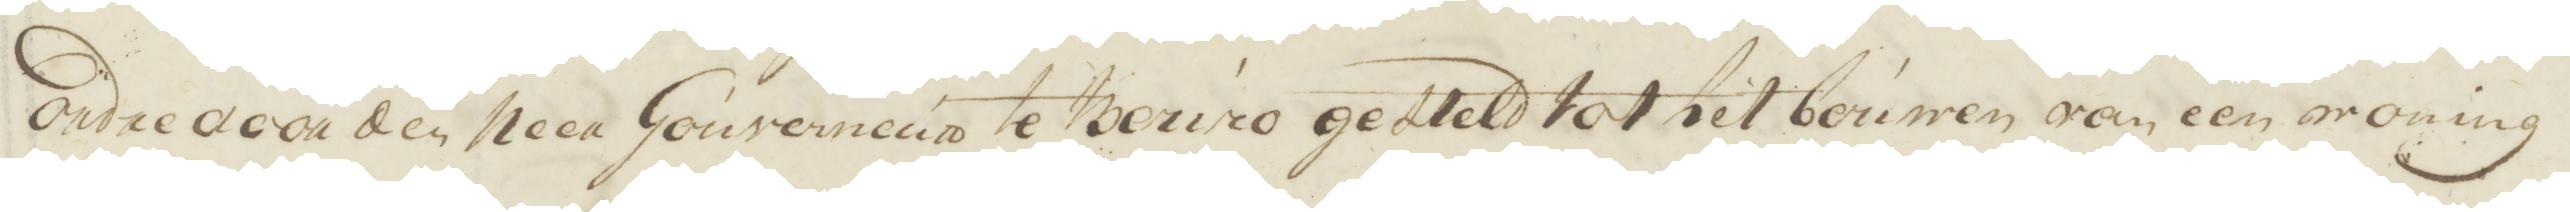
ordre door den Heer Gouverneur te Beriro gesteld tot het bouwen van een woning
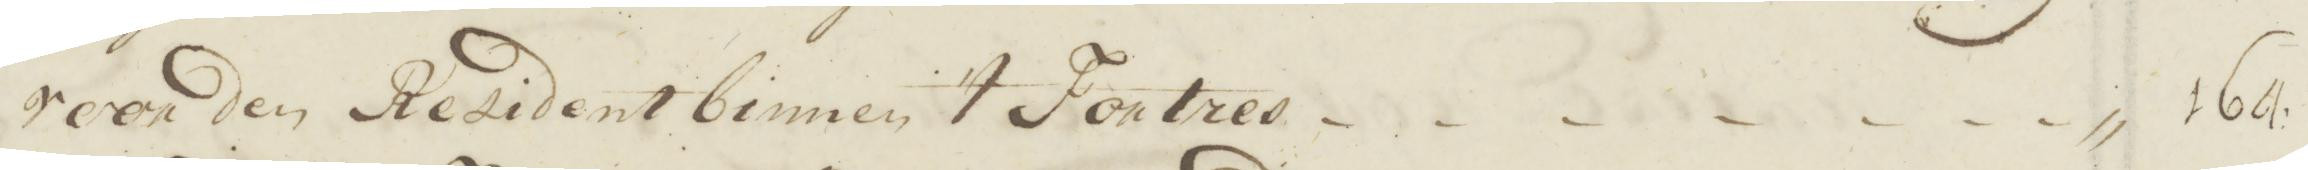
voor den Resident binnen ’t Fortres - - - - - - - „ 164.
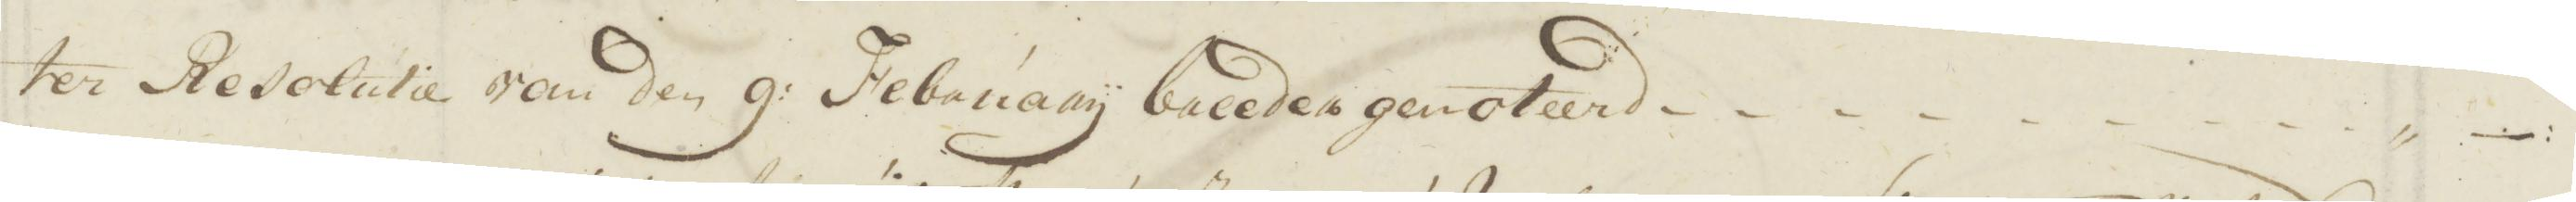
ter Resolutie van den 9: Februarij breeder genoteerd - - - - - - - - - „ —:
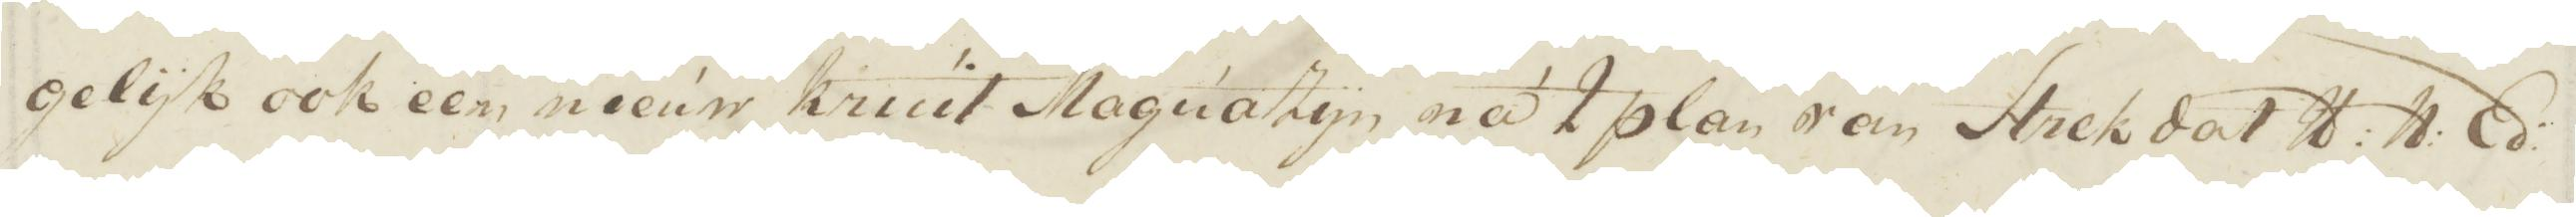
gelijk ook een nieuw kruit Maguazijn na 't plan van strek dat H: H: Ed:
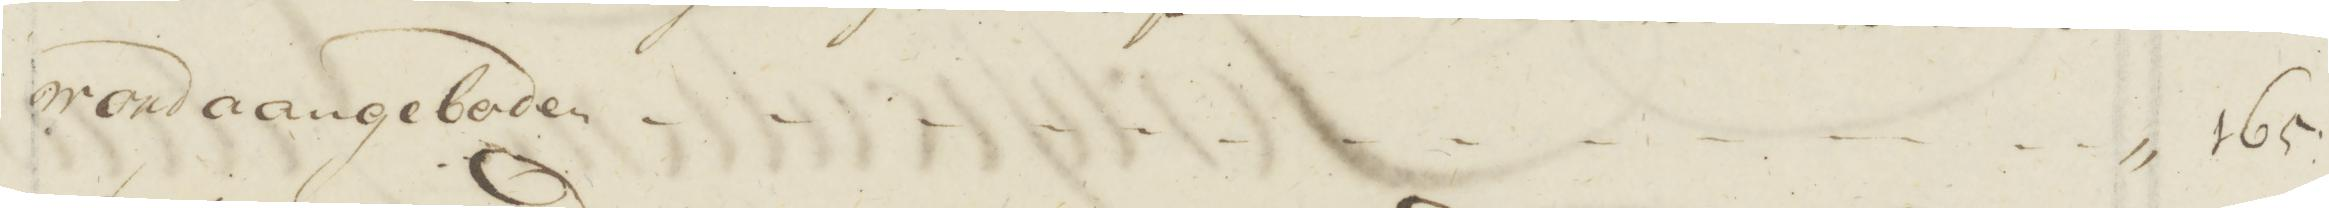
word aangeboden - - - - - - - - - - - - - - „ 165:
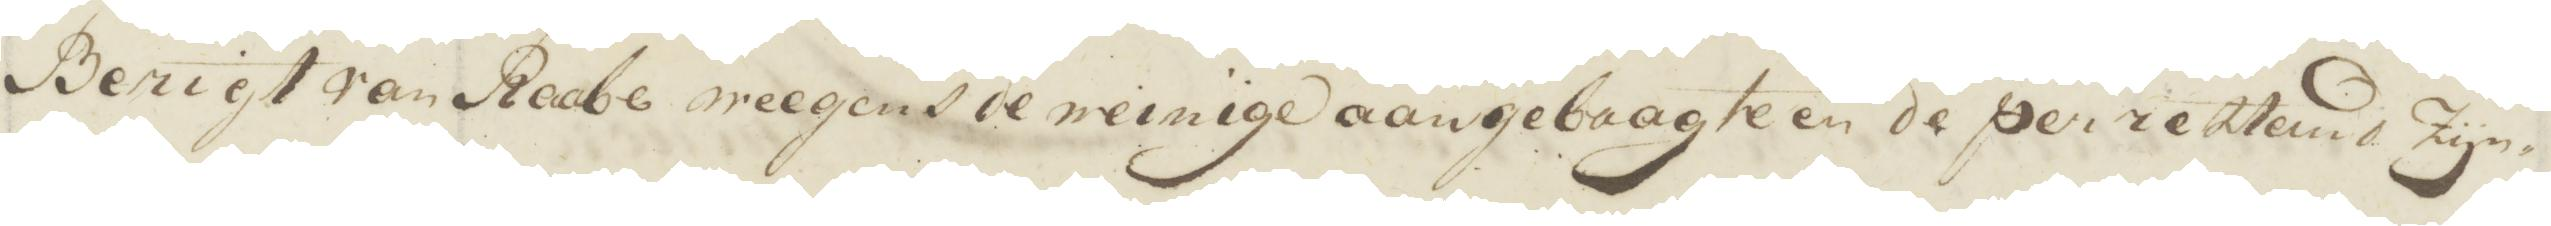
Berigt van Raabe weegens de weinige aangebragte en de per restemd zijn„
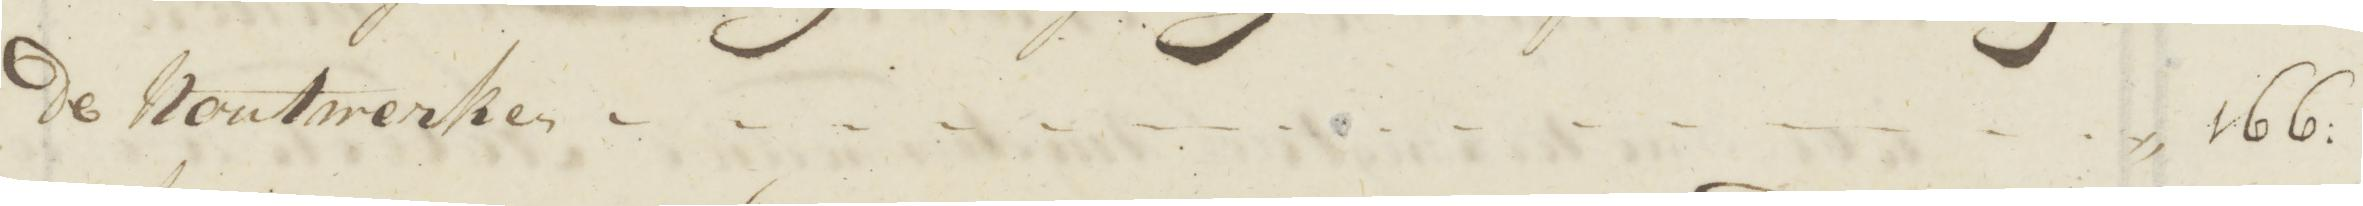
de Houtwerken - - - - - - - - - - - - - - - - „ 166:
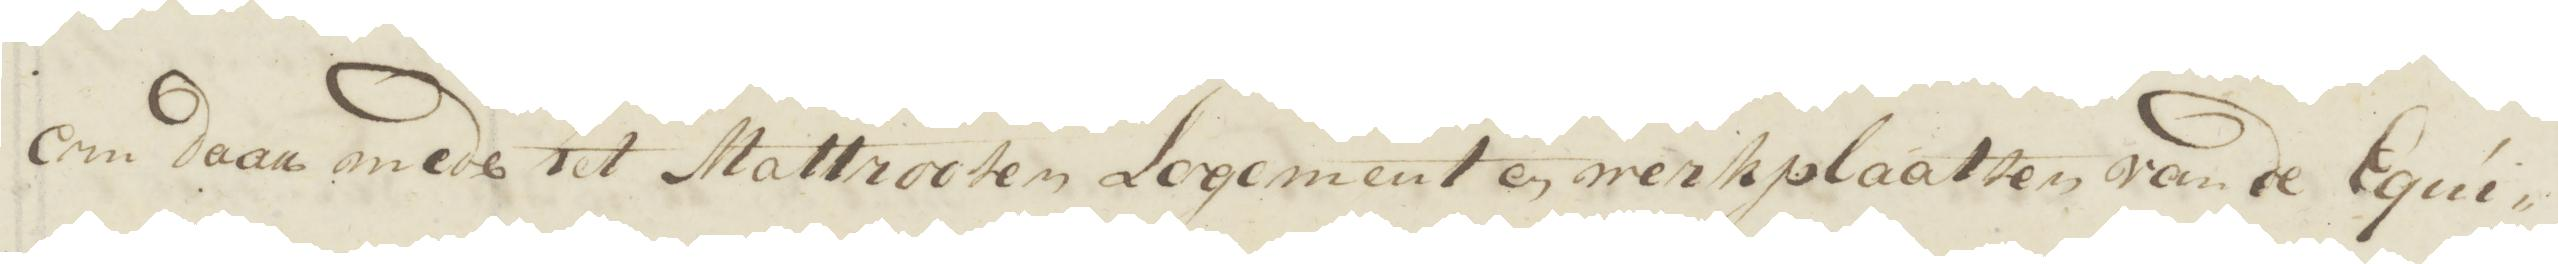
Om daar mede het Mattroosen Logement en werkplaatsen van de Equi„
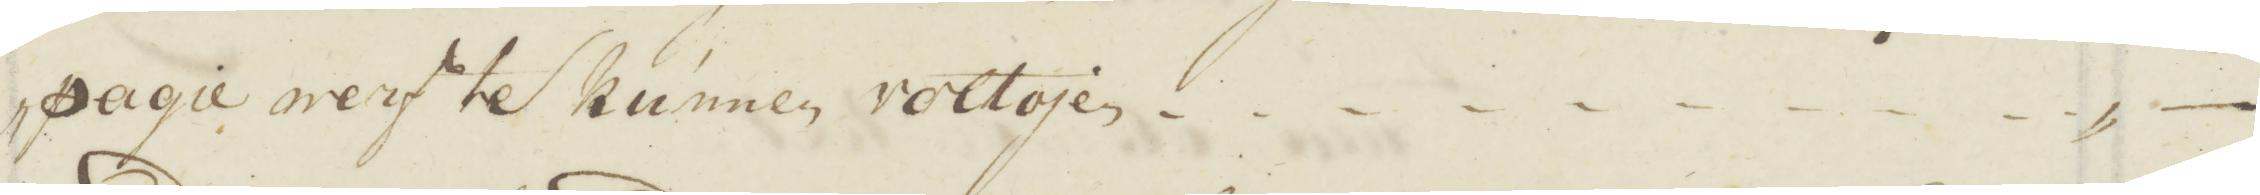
„pagie werf te kunnen voltojen - - - - - - - - - „ —
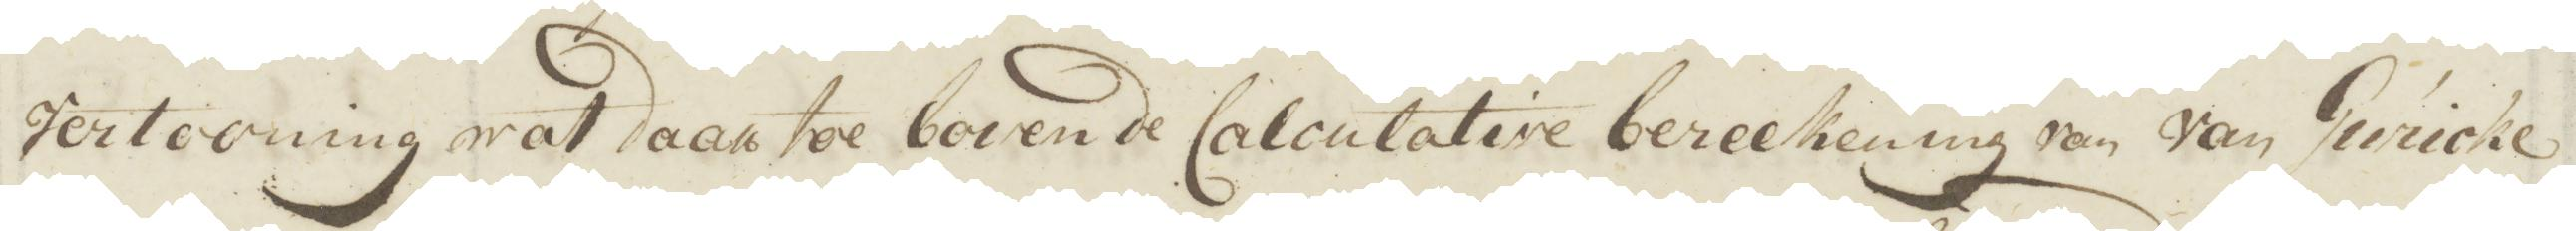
Vertooning wat daar toe boven de calculative bereekening van van Guricke
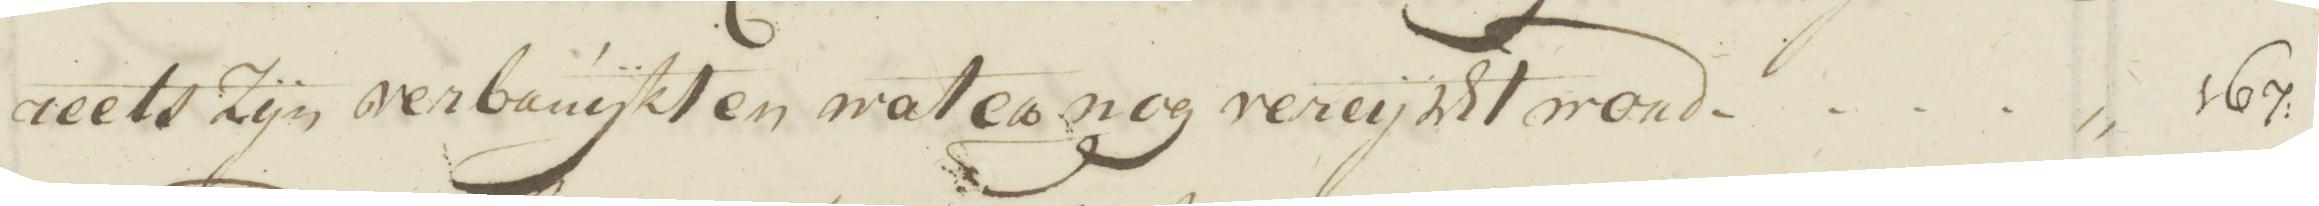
reets zijn verbruijkt en wat er nog vereijscht word- - - - „ 167:
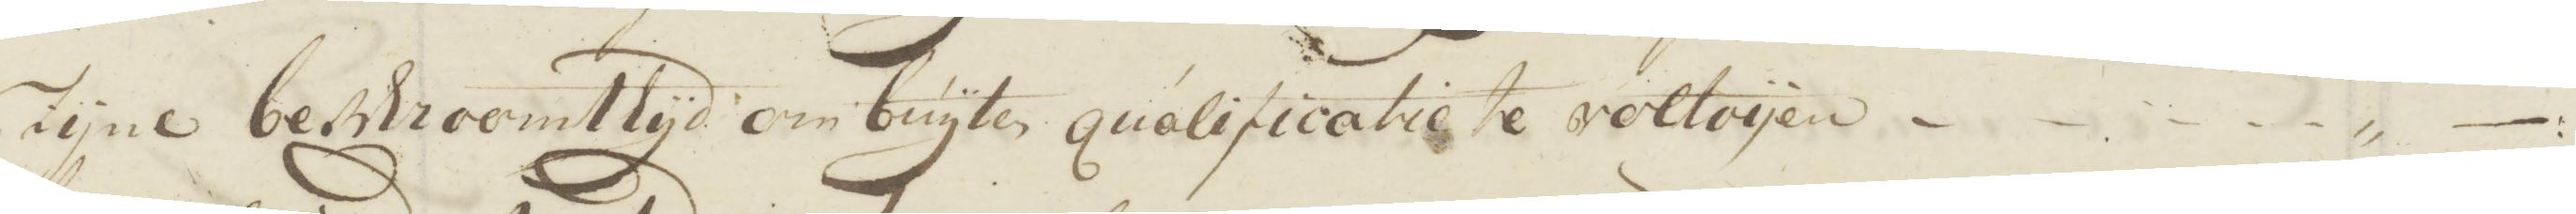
zijne beschroomtlijd om buijten qualificatie te voltoijen - - - - - „ —:
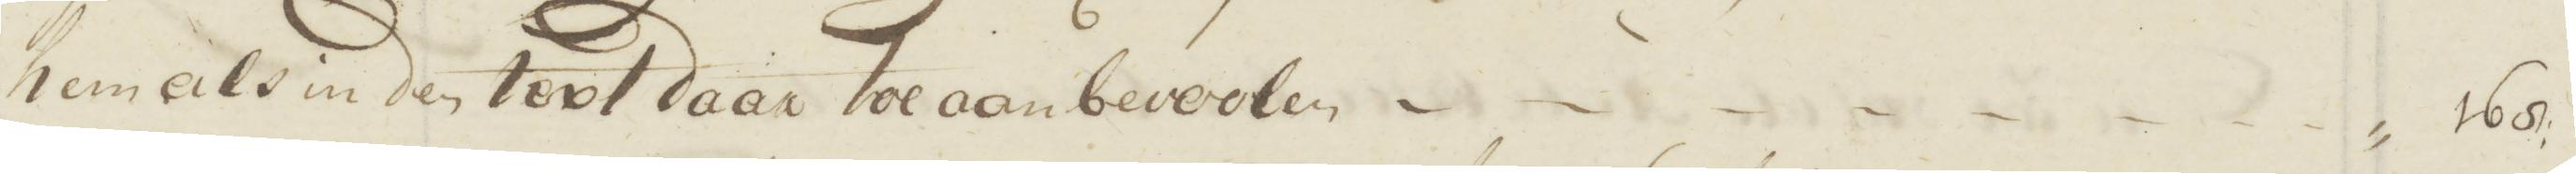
hem als in den text daar toe aanbevoolen - - - - - - - - „ 168:
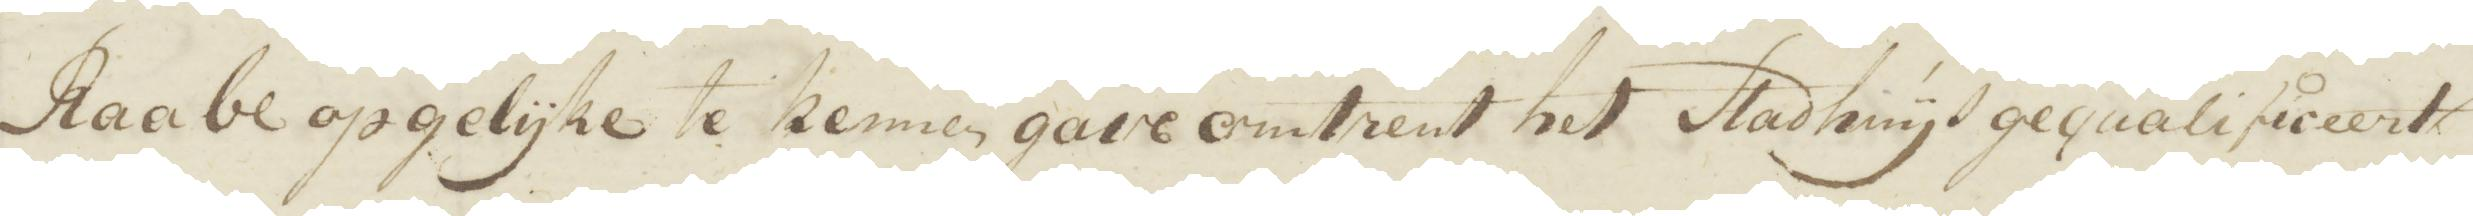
Raabe op gelijke te kennen gave omtrent het Stadhuijs gequalificeert
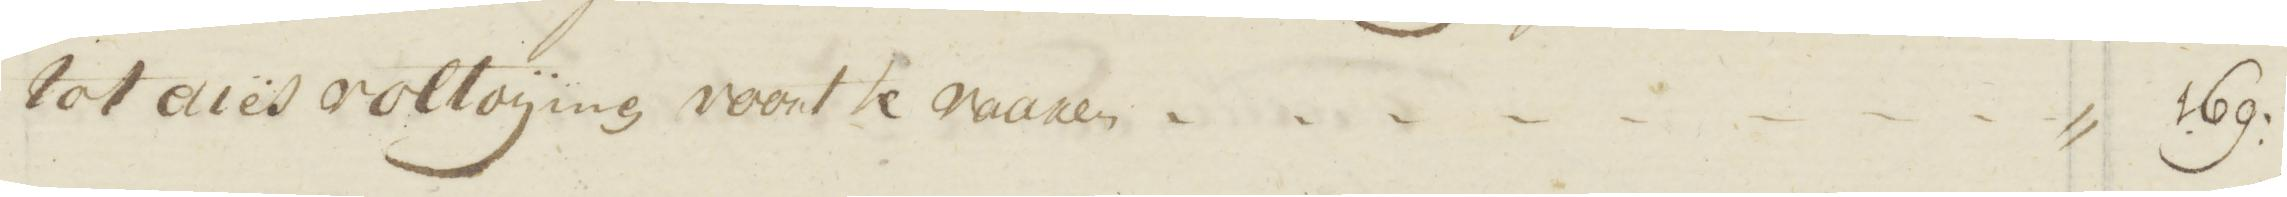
tot dies voltoijing voort te vaaren - - - - - - - - „ 169:
